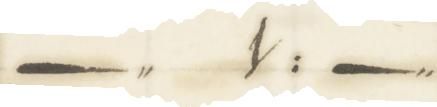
— „1: —„
